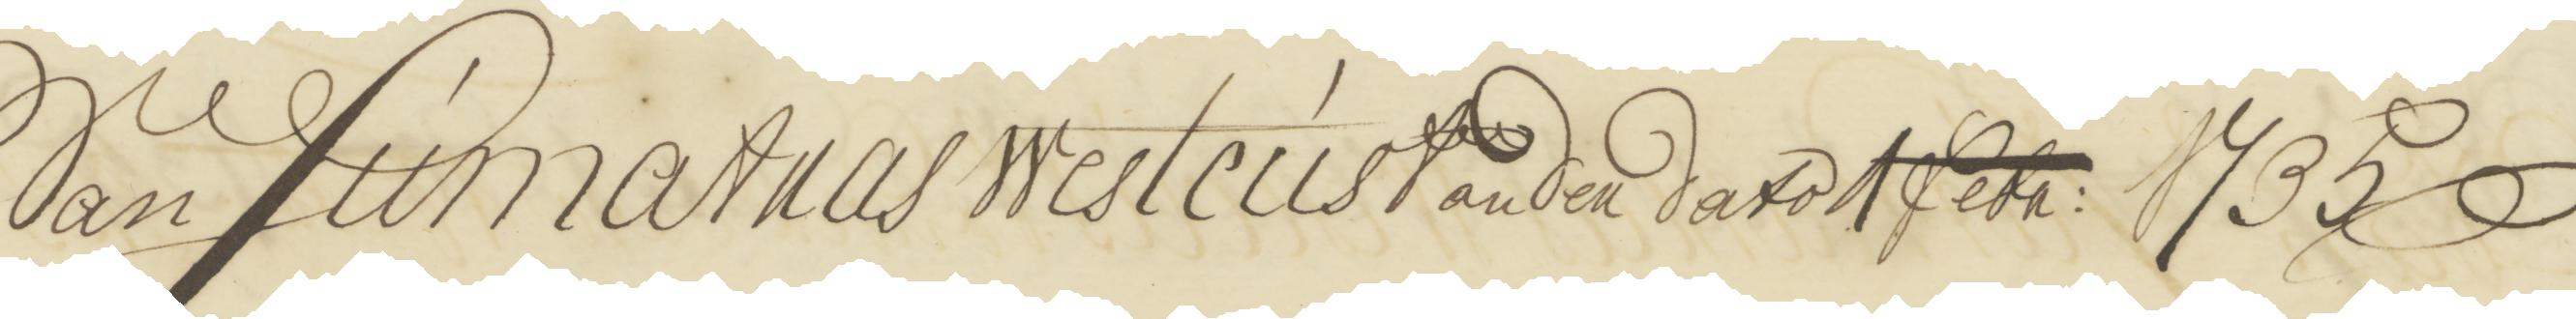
Van Sumatras west cust onder dato 1 febr: 1735
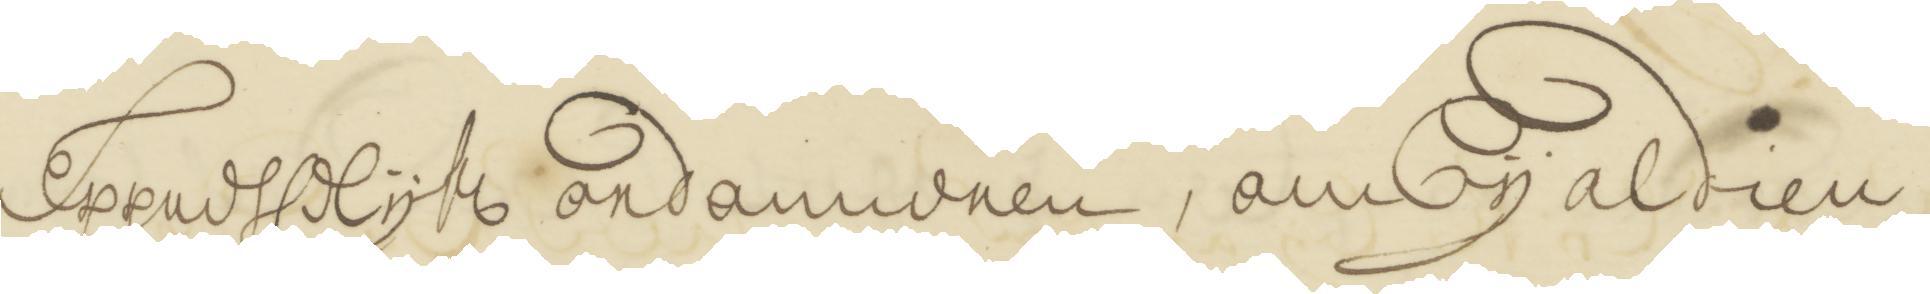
Expresselijk ordonneren, om bij al dien
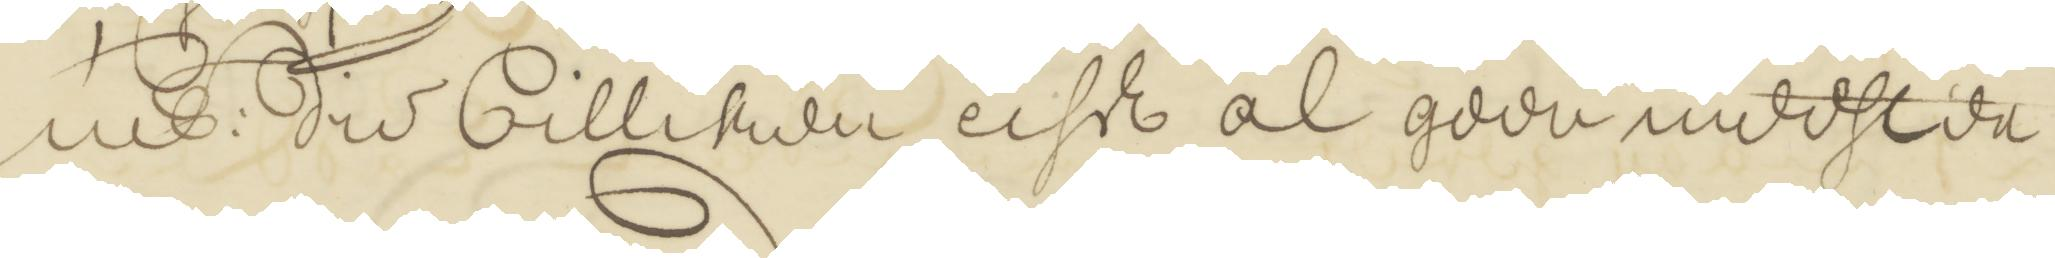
uE. die billiken eisch al geen meester
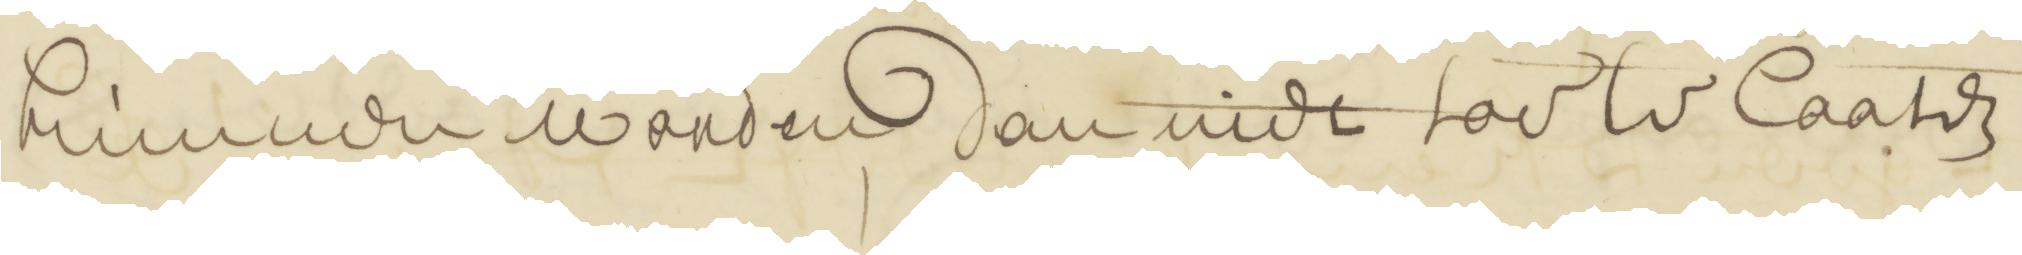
kunnen worden dan niet toe te laaten
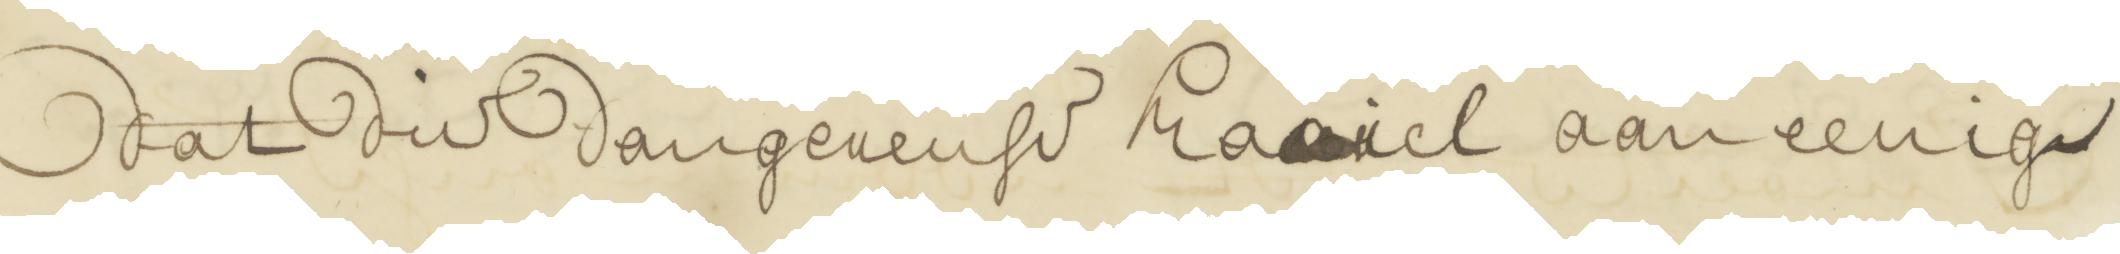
dat die dangereuse kaarel aan eenige
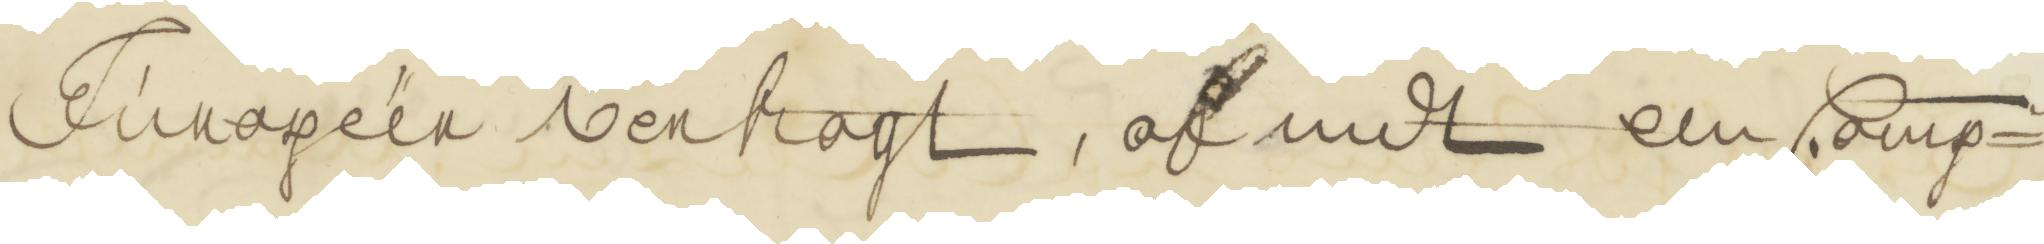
Europeër verkogt, of met een Comp=
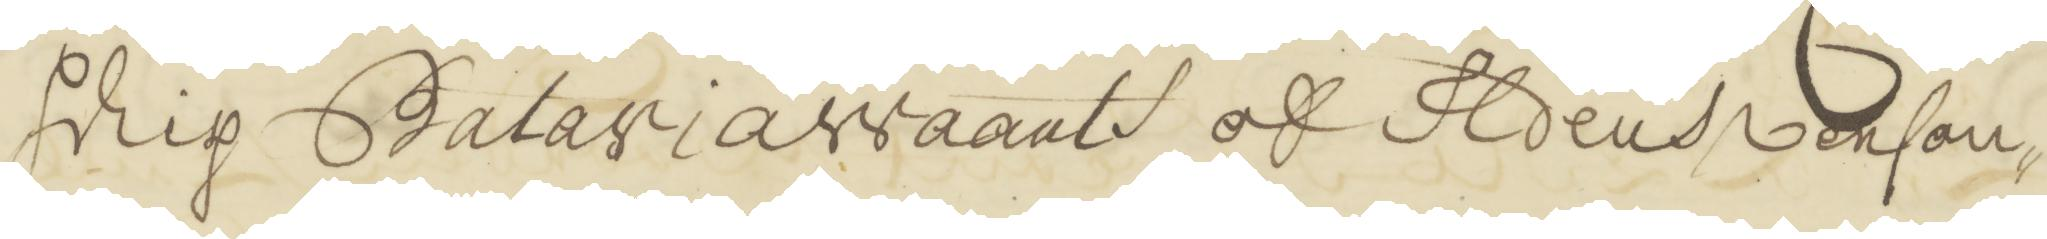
schip Bataviawaarts of Elders verson„
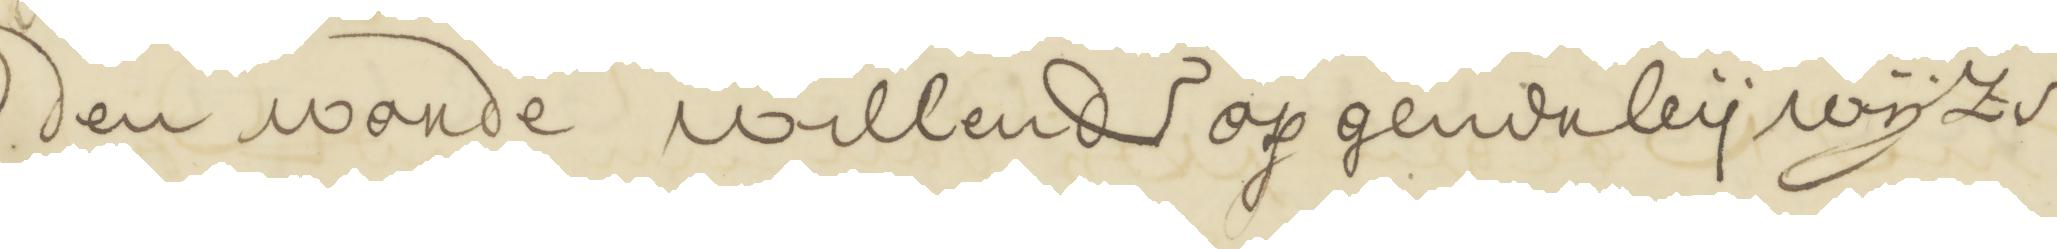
den worde willende op generleij wijze
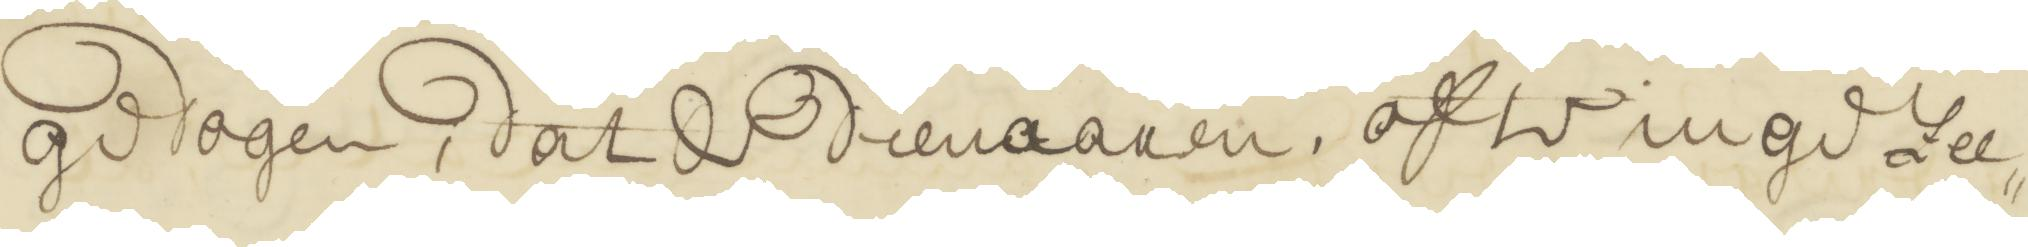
gedogen, dat de dienaaren, ofte ingezee
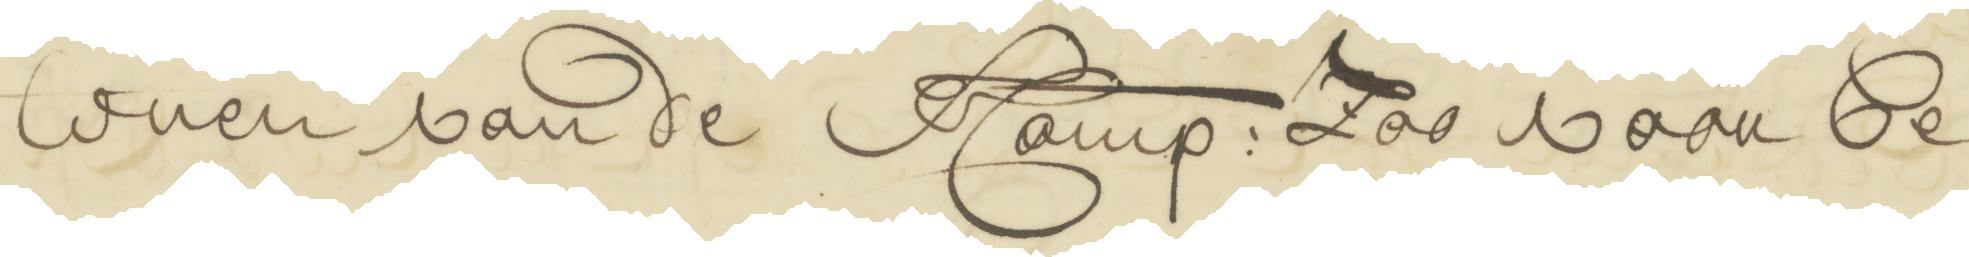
tenen van de EComp: Zoo voor be
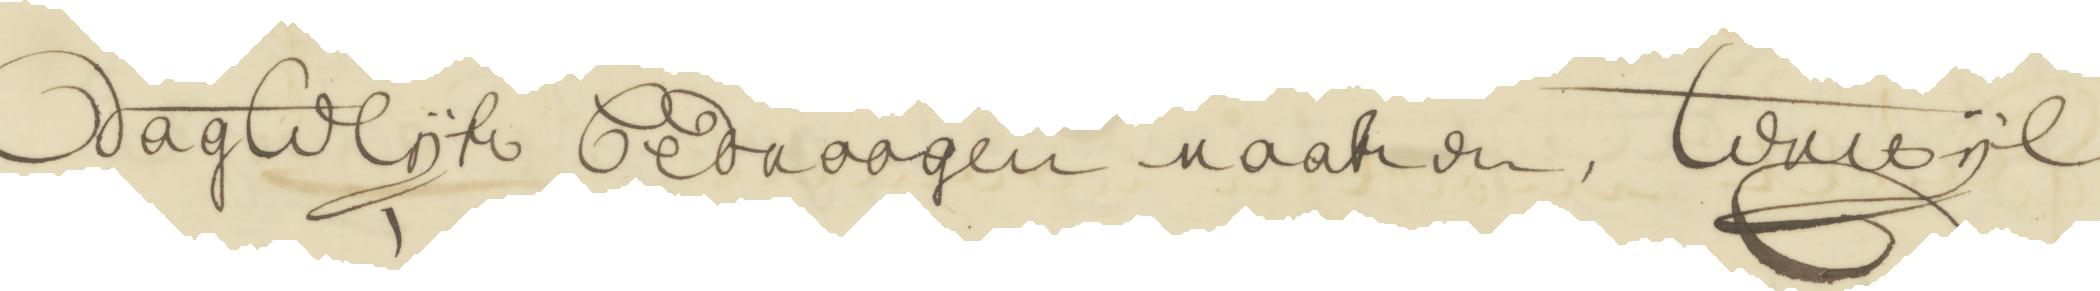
dagtelijk bedroogen raaken, terwijl
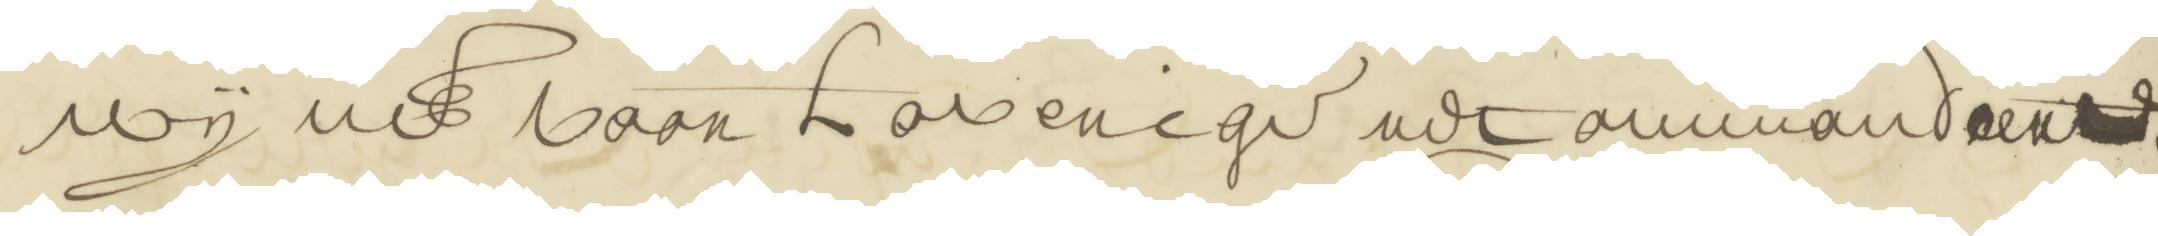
wij uE voor 't overige recommandeeren
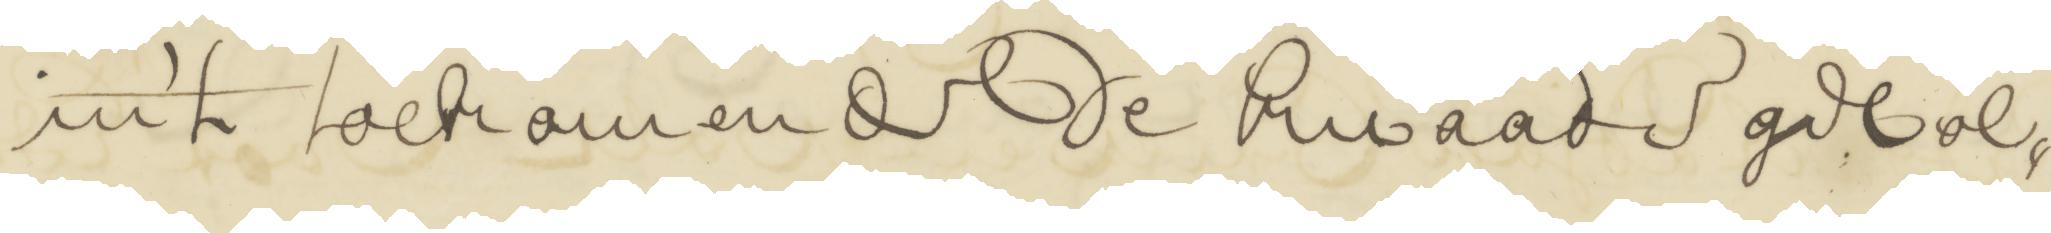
in ’t toekomende de kwaade gevol
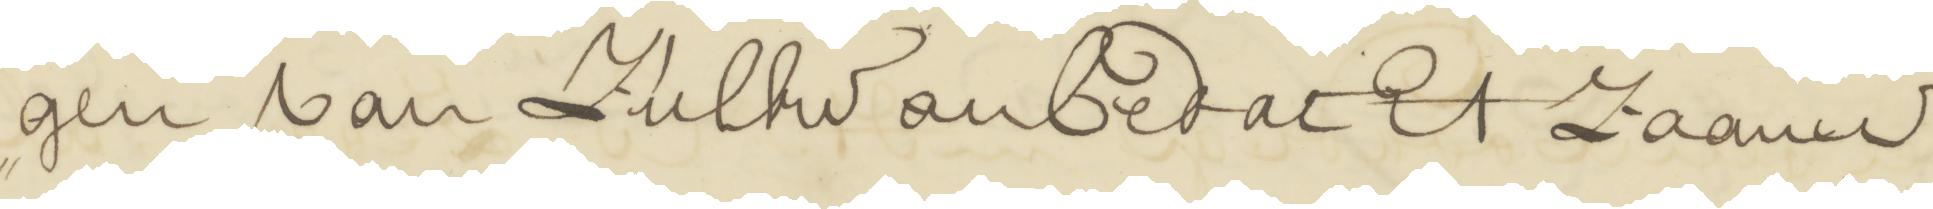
„gen van Zulke onbedachtzaame
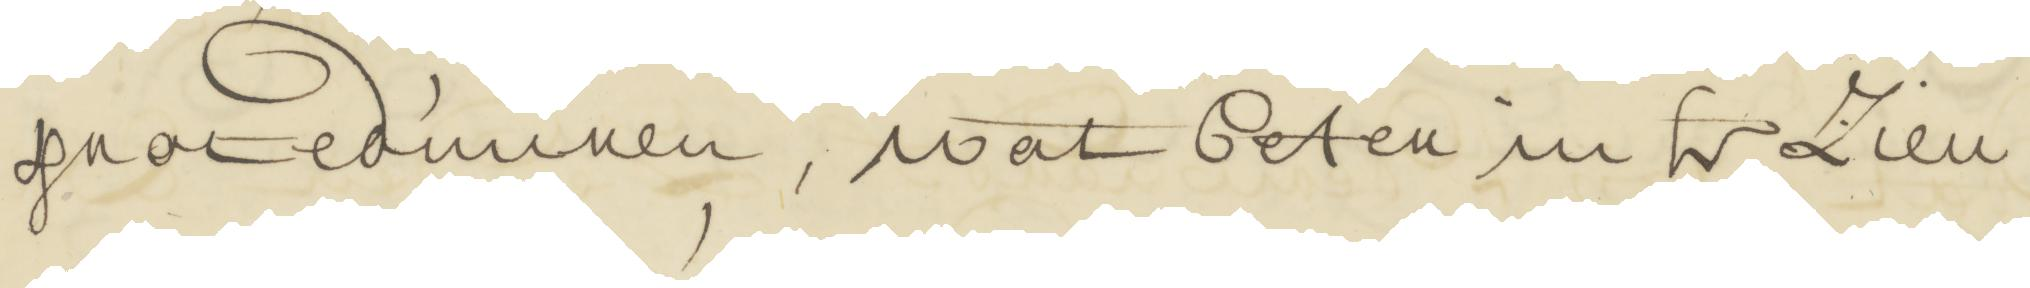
proceduuren, wat beter in te Zien
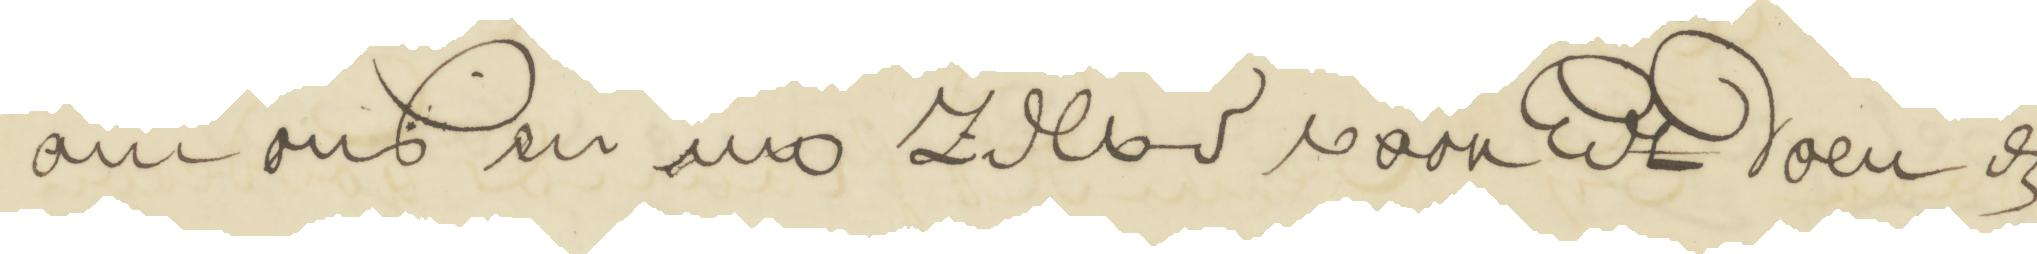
om ons en uw Zelve voor het doen en
